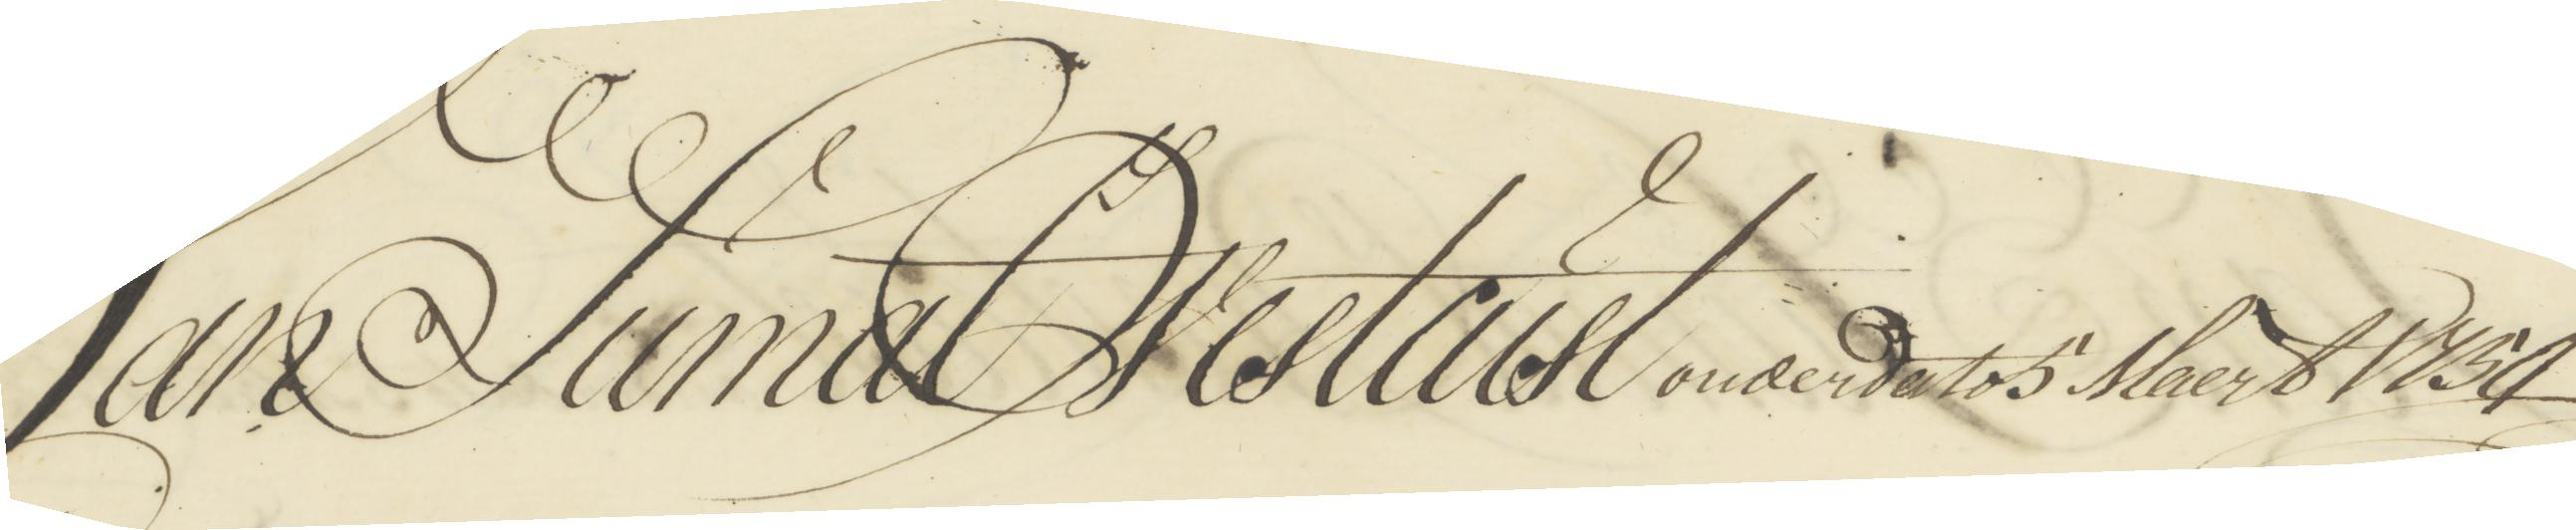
Van Sumats west cust onderdato5 Maert 1754
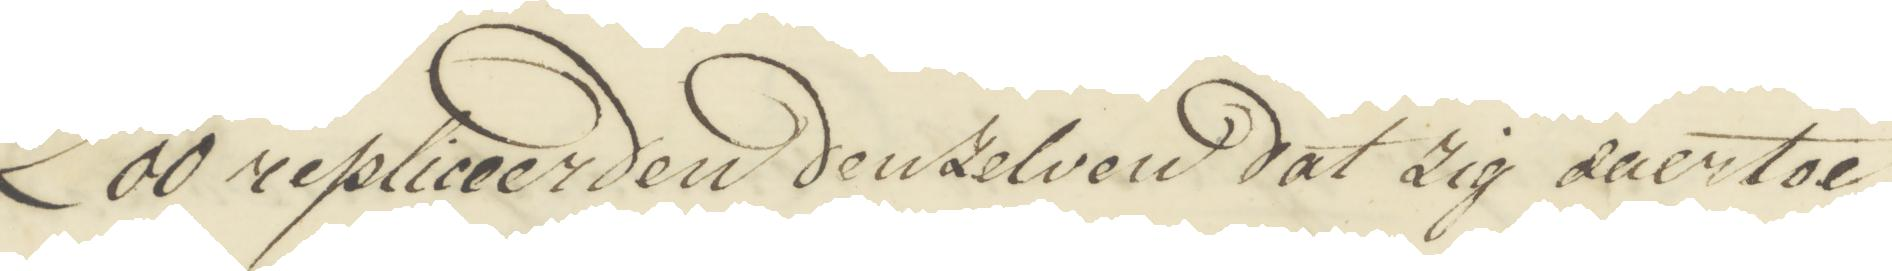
Zoo repliceerden denzelven dat zig daertoe
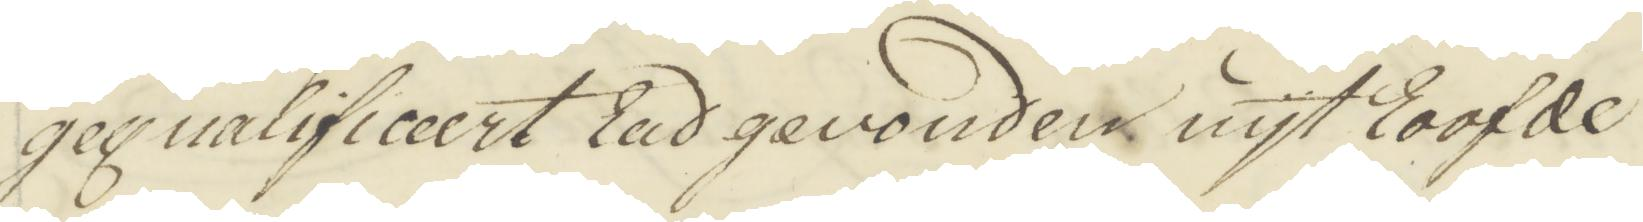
gequalificeert had gevonden uijt hoofde
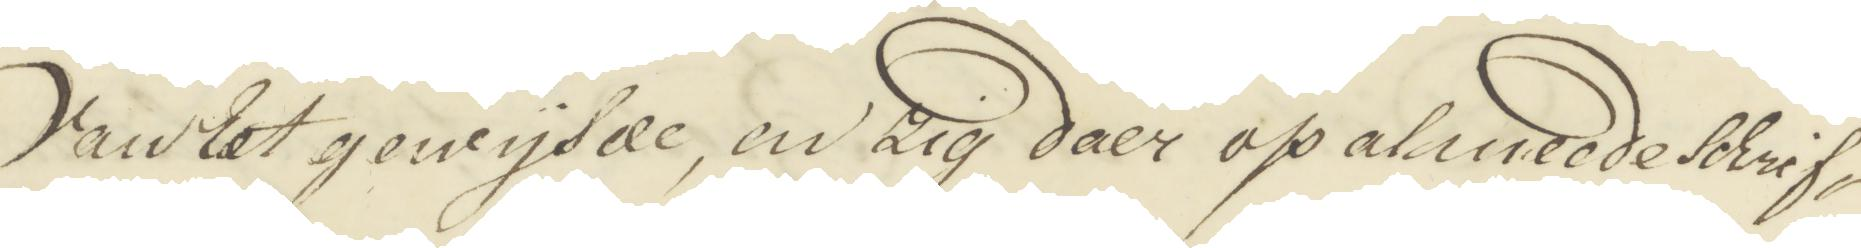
Van het gewijsde, en zig daer op almeede schrif
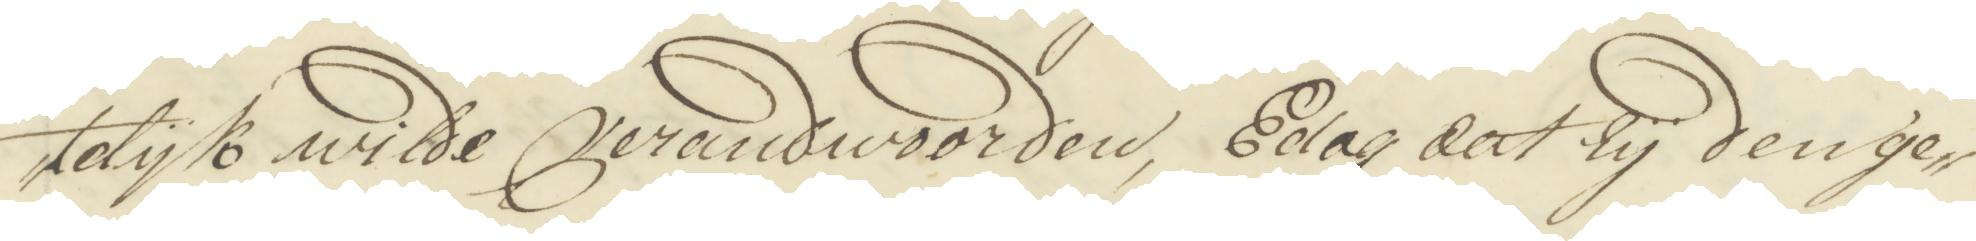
„telijk wilde verandwoorden, Edog dat hij den ge„
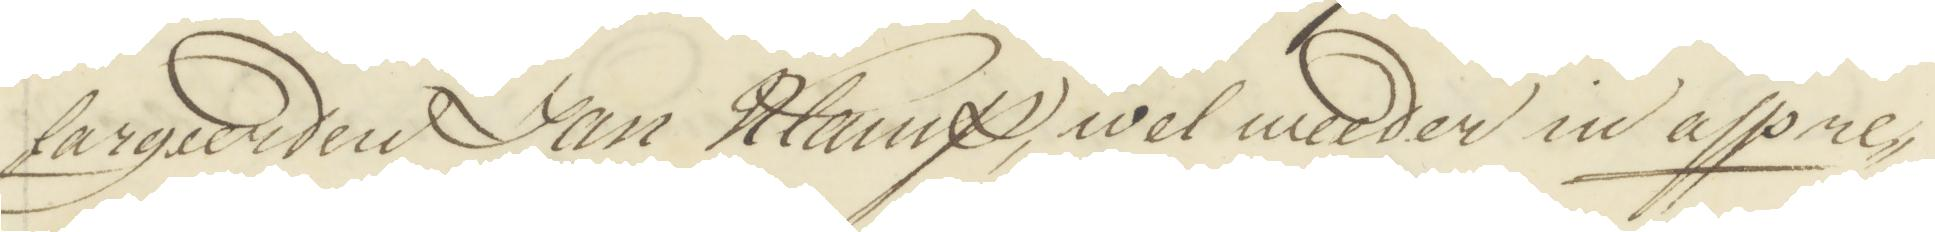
largeerden Jan Klamp wel weeder in appre„
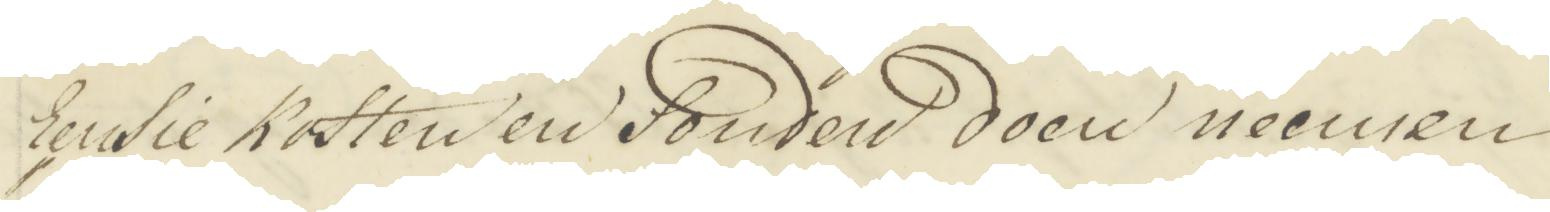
hensie kosten en souden doen neemen
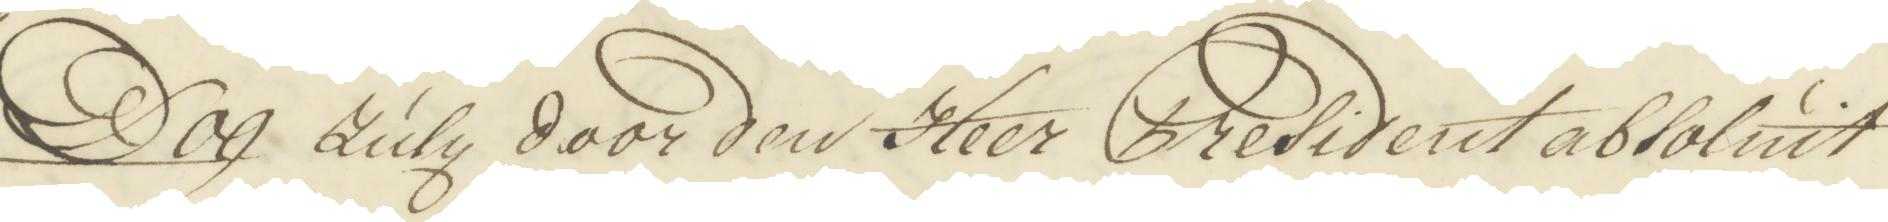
Dog zulx door den Heer President absoluit
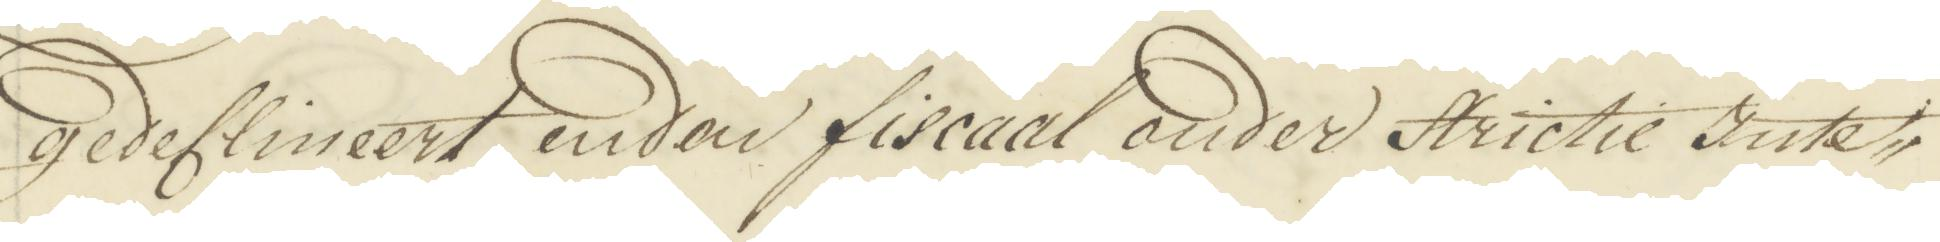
gedclineert, enden fiscaal onder strictie inte„
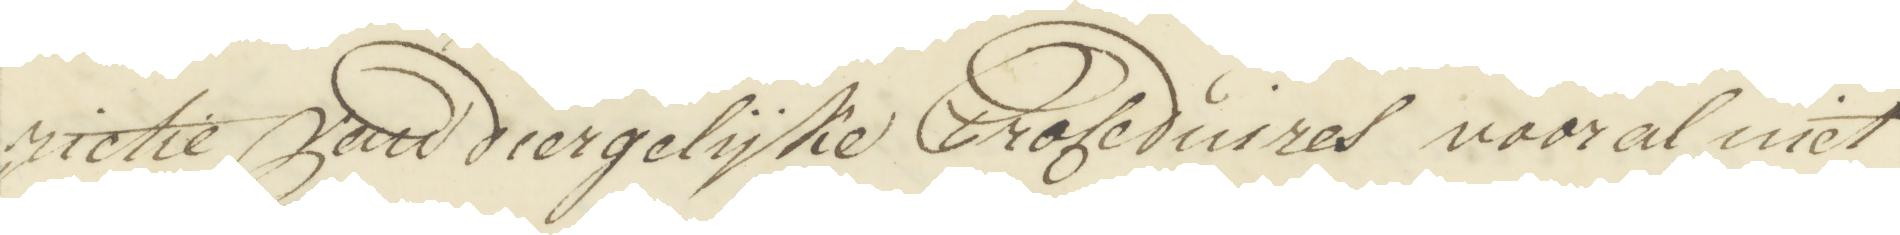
„rictie van diergelijke Proceduires voor al niet
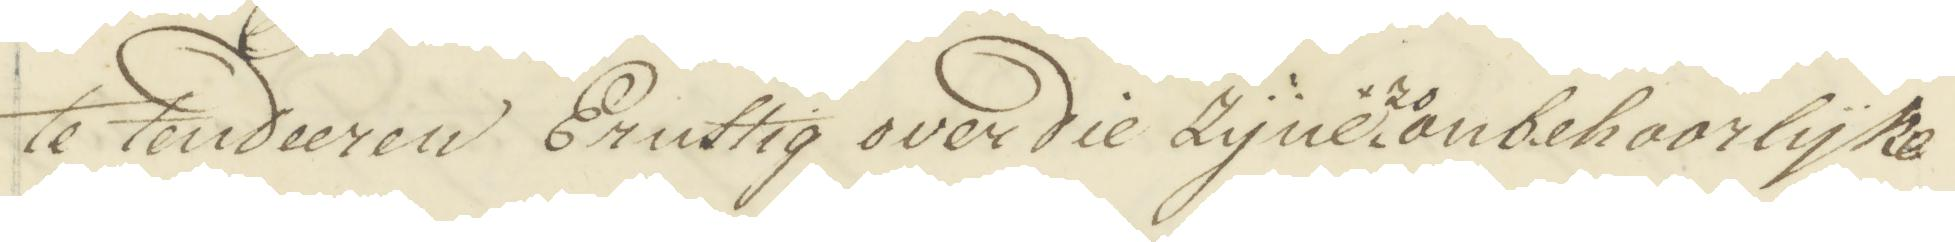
te tendeeren Ernstig over die zijne x zo onbehoorlijke
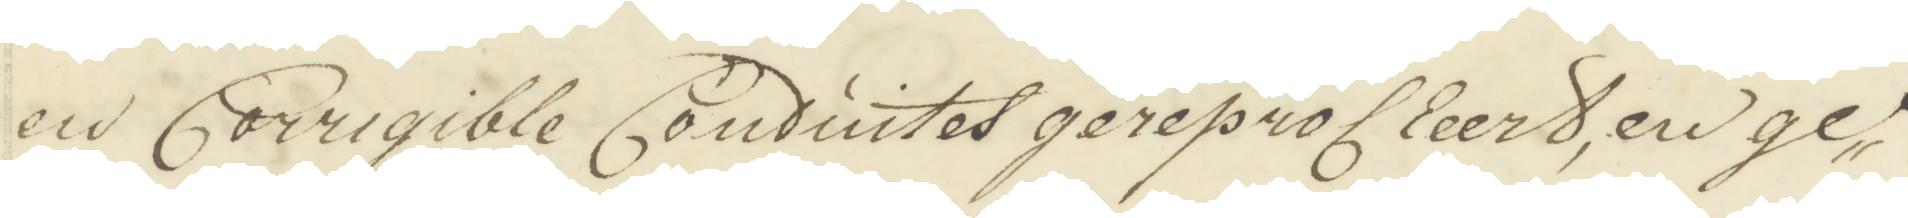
en Corrigible Conduites gereprocheert, en ge„
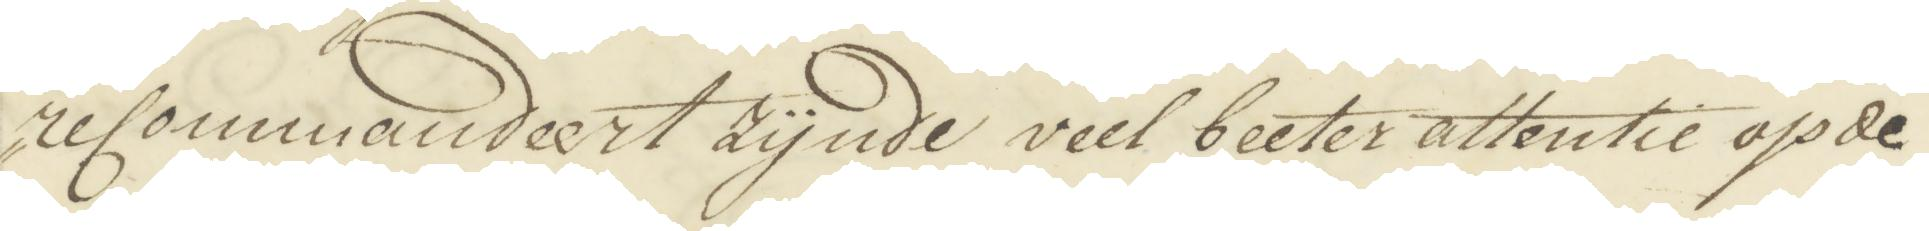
recommandeert zijnde veel beeter attentie op de
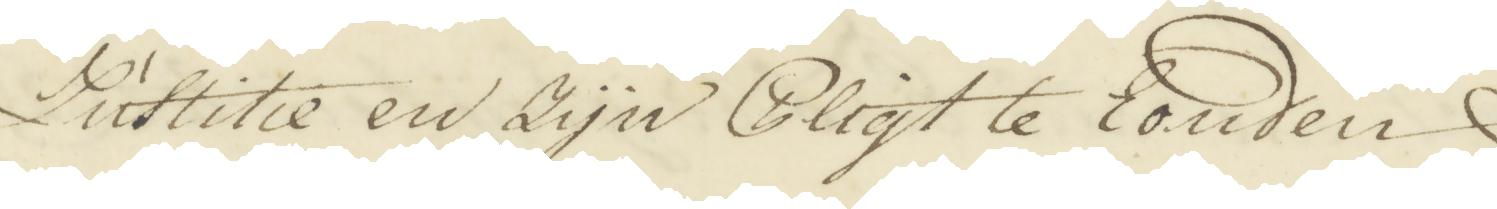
Justitie en zijn Pligt te houden
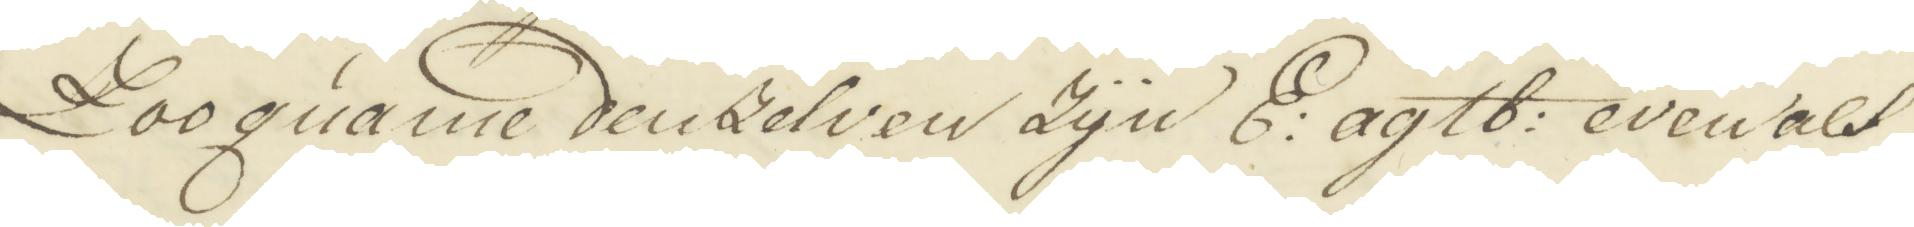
Zoo quame denzelven zijn E: agtb: even als
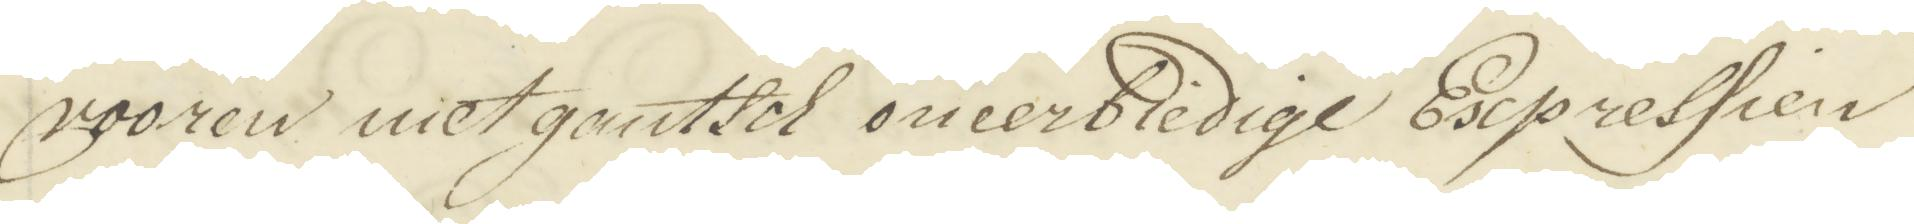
vooren niet gantsch oneerbiedige Expressien
